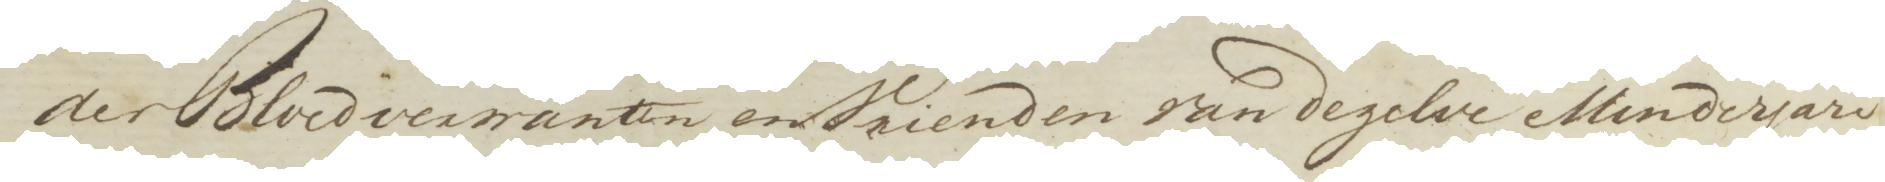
der Bloedverwanten en Vrienden van dezelve Minderjari
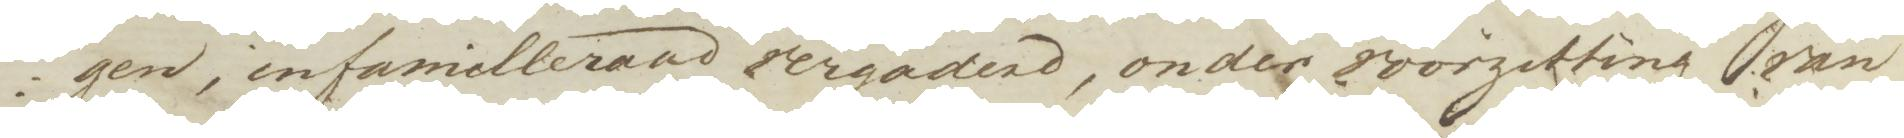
„gen, in familleraad vergaderd, onder voorzitting van
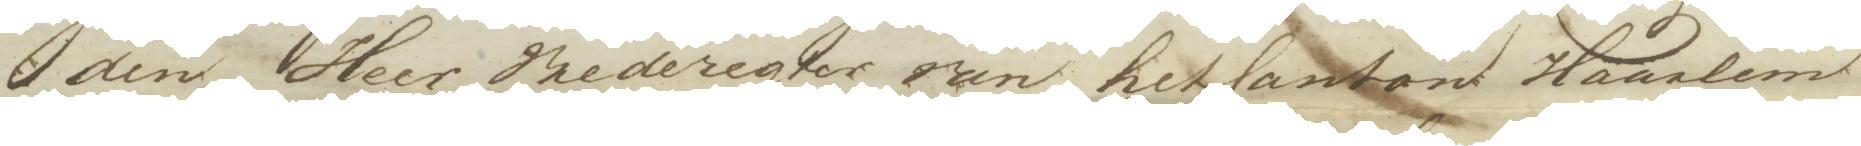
den Heer Vrederegter van het Canton Haarlem
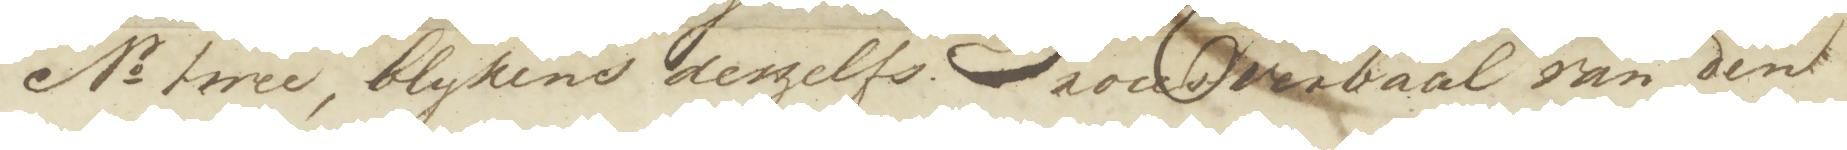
N-o twee, blykens deszelfs Proces verbaal van den
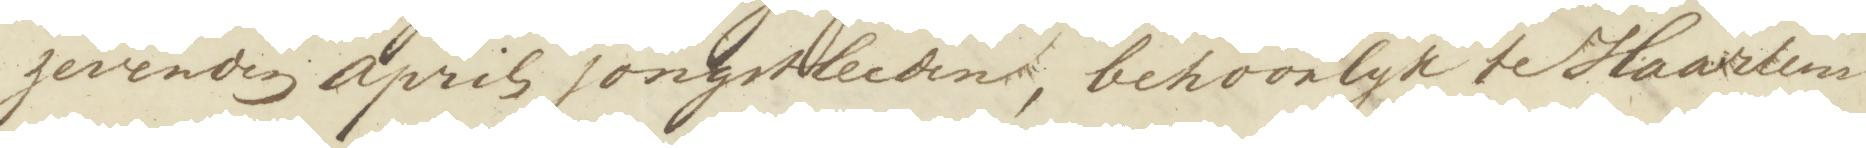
zevenden April jongstleeden, behoorlyk te Haarlem
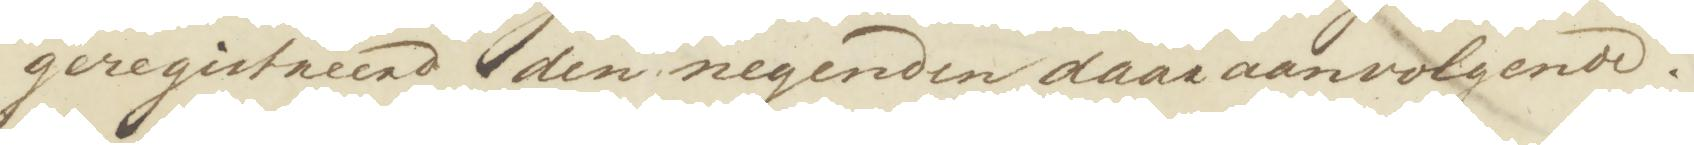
geregistreerd den negenden daar aanvolgende.
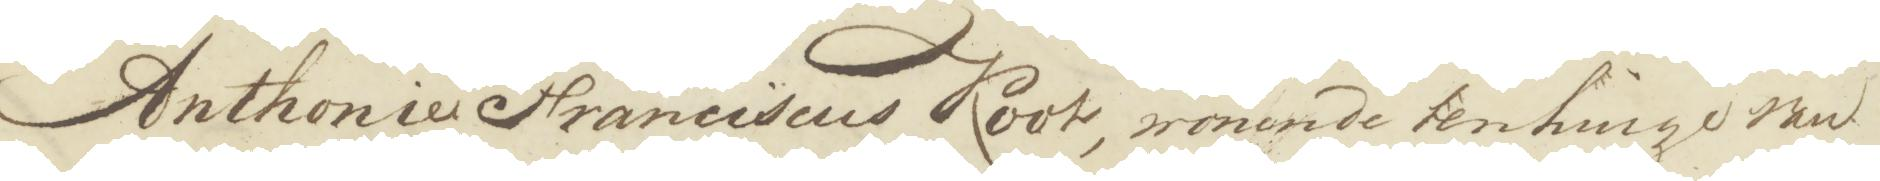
Anthonie Franciscus Koot, wonende ten huize van
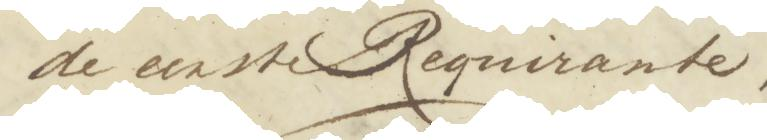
de eerste Requirante
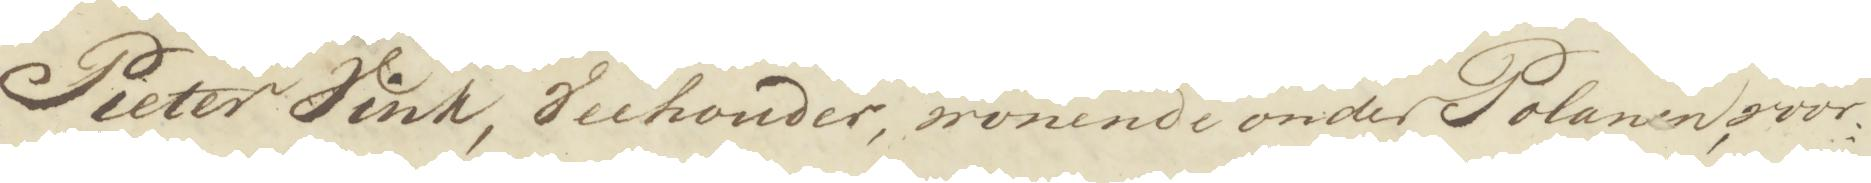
Pieter Vink, Veehouder, wonende onder Polanen, voor„
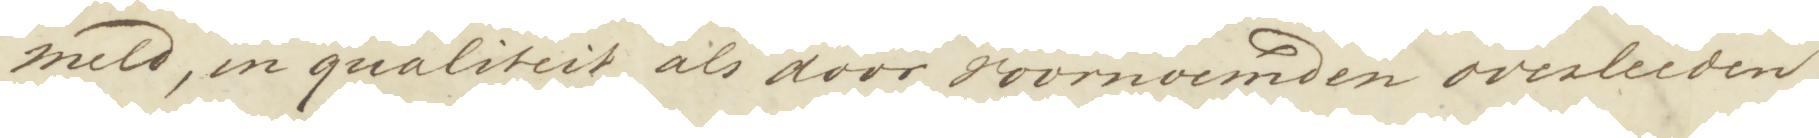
meld, in qualiteit als door voornoemden overleeden
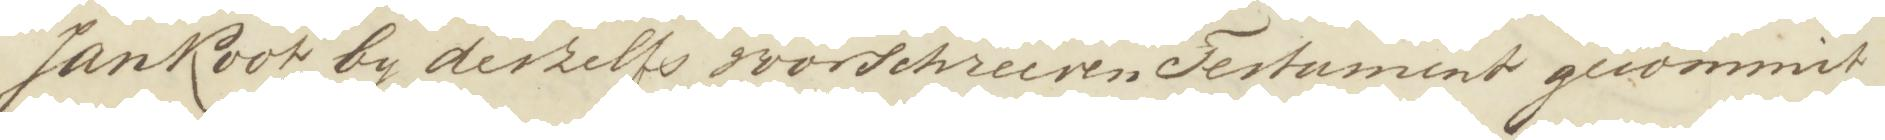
Jan Koot by deszelfs voorschreeven Testament gecommit
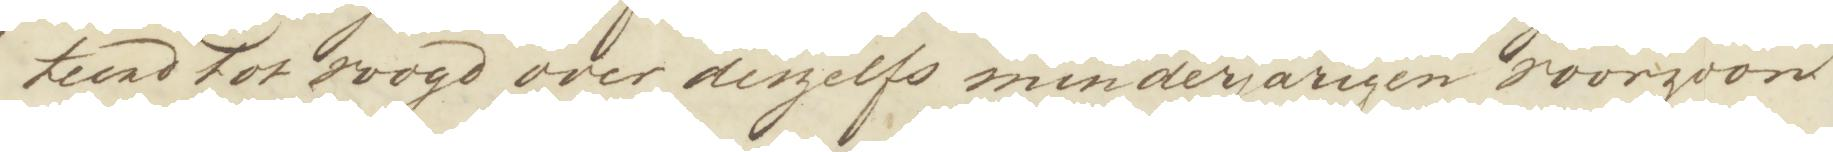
teerd tot voogd over deszelfs minderjarigen voorzoon
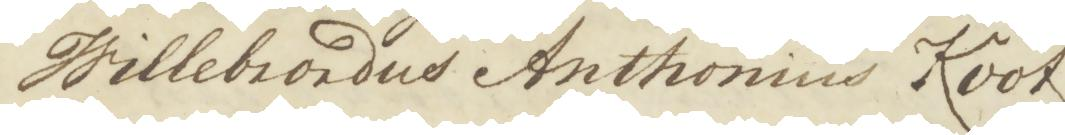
Willebrordus Anthonius Koot
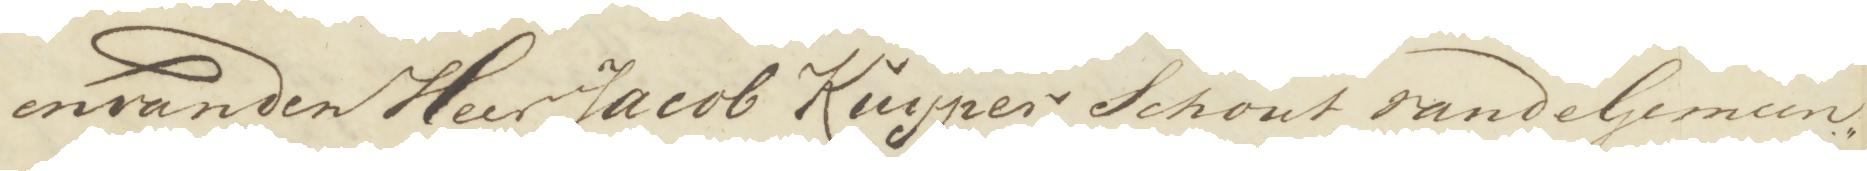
en van den Heer Jacob Kuyper, Schout van de Gemeen„
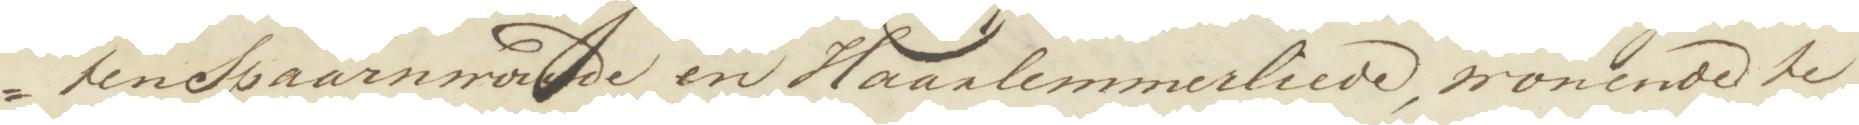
„ten Spaarnwoude en Haarlemmerliede, wonende te
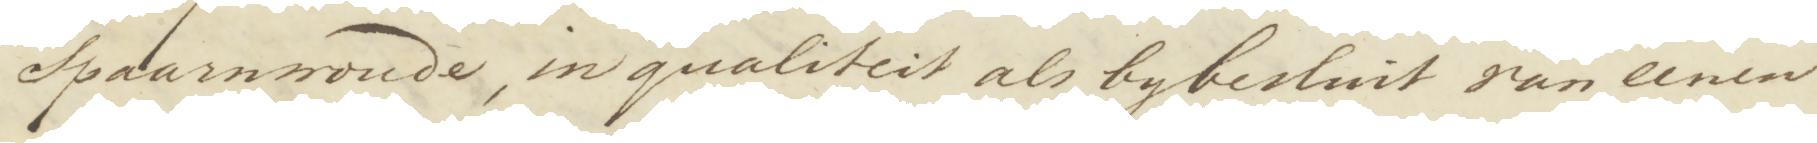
Spaarnwoude, in qualiteit als by besluit van eenen
